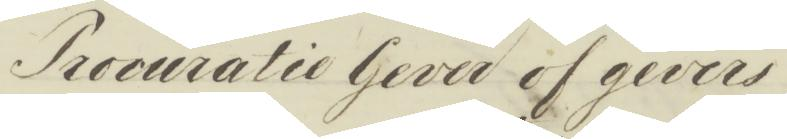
Procuratie Gever of gevers
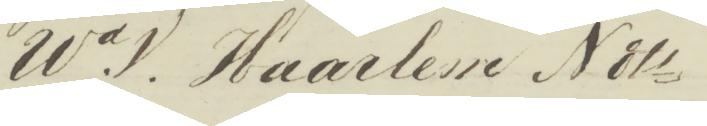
W.d V. Haarlem Not=s
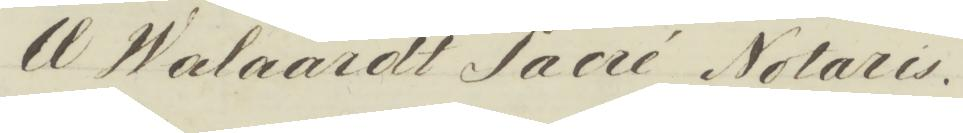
A Walaardt Sacré Notaris.
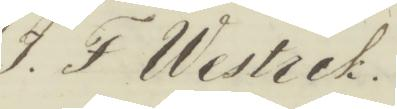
I. F Westrik.
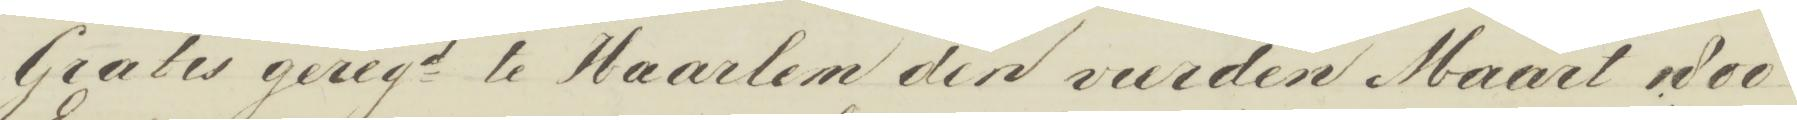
Gratis gereg=d te Haarlem den vierden Maart 1800
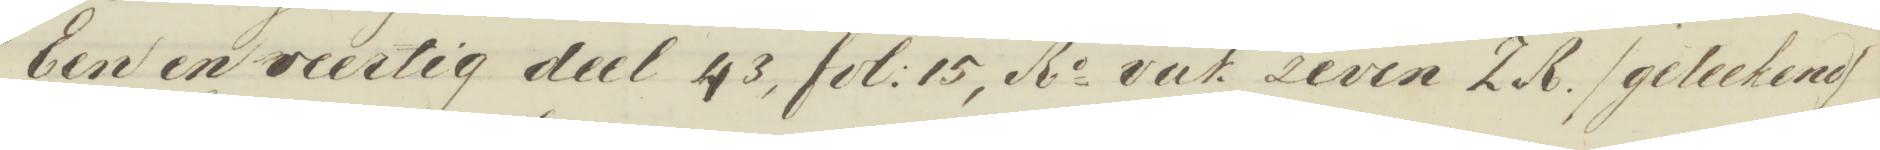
Een en veertig deel 43, fol: 15, R.=o vak zeven ZR. /geteekend/
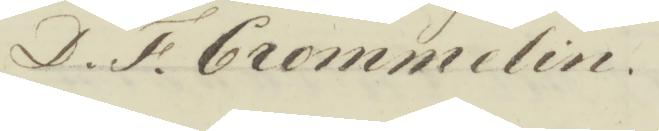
D. F. Crommelin.
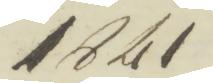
1841
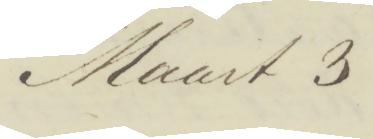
Maart 3
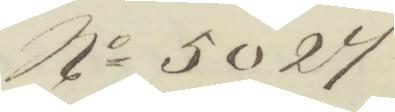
N=o 5027
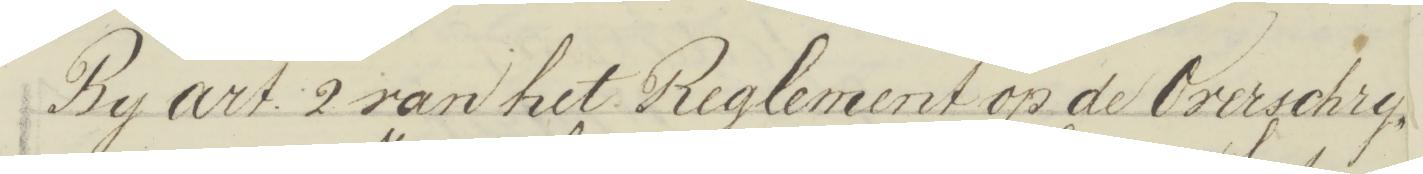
By art: 2 van het Reglement op de Overschry„
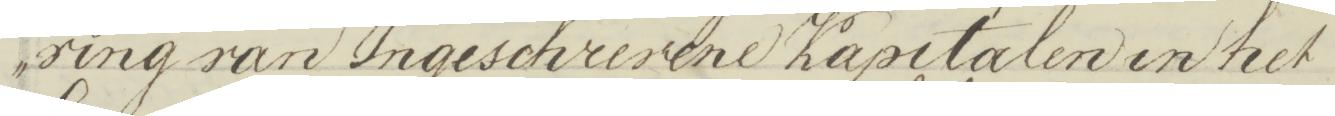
„ving van Ingeschrevene Kapitalen in het
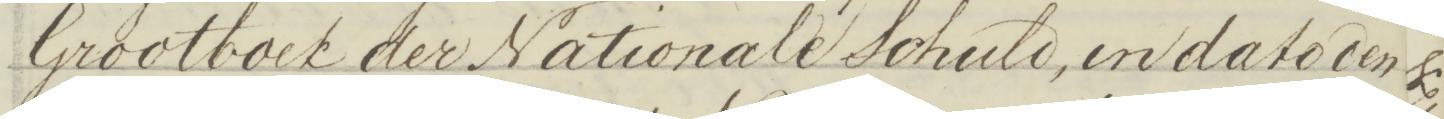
Grootboek der Nationale Schuld, in dato den
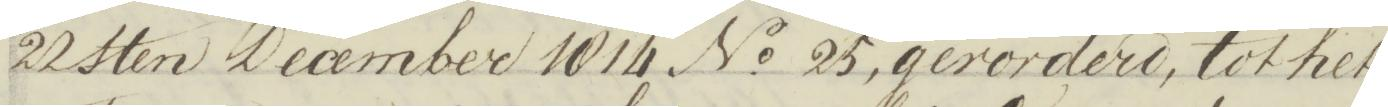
22sten December 1814 N.o 25, gevorderd, tot het
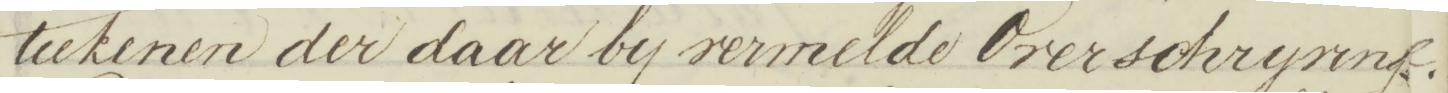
teekenen der daar by vermelde Overschryving.
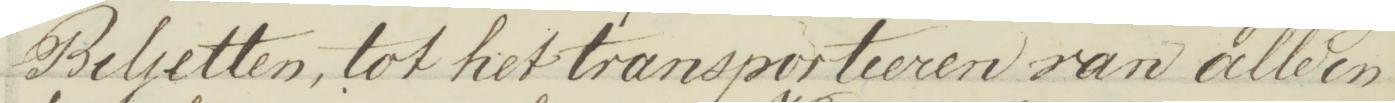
Biljetten, tot het transporteeren van alle en
